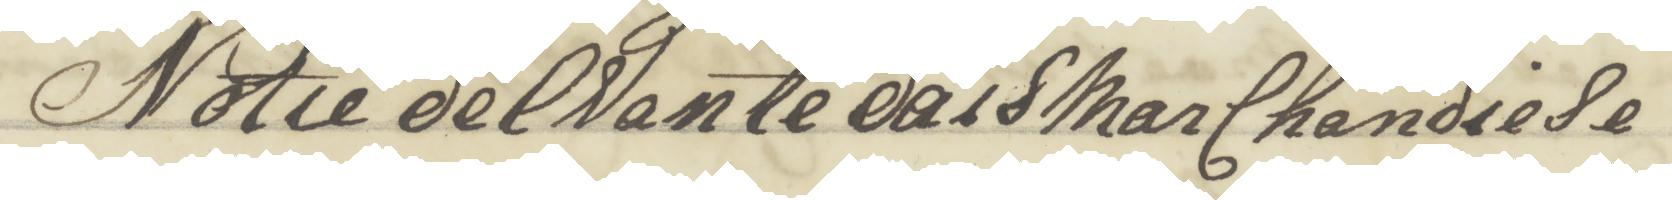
Notie del Vante dais Marchandiese
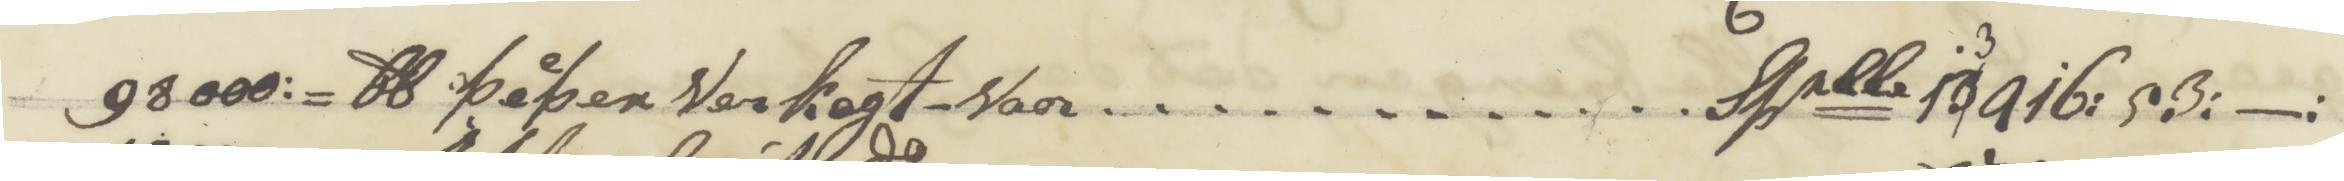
98000: = lb peeper Verkogt - Voor - - - - - - - - - - - - Sp=rlle 13416: 53 : —:
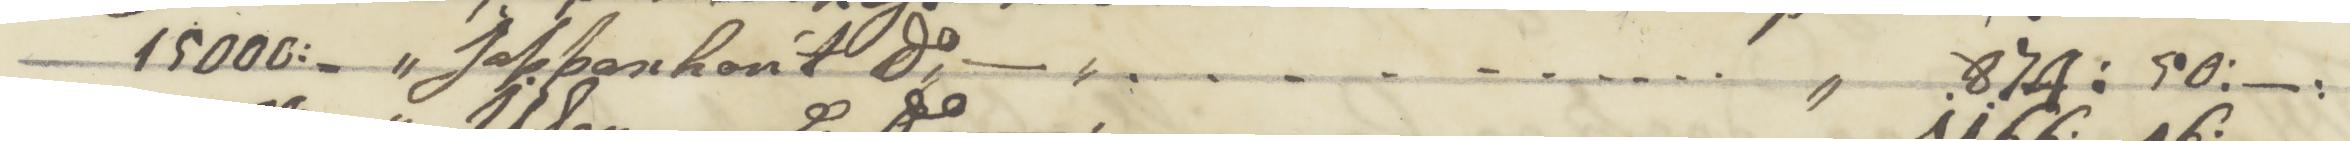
15000: - „ Jappanhout d„o — „ - - - - - - - - - - „ 874: 50: —:
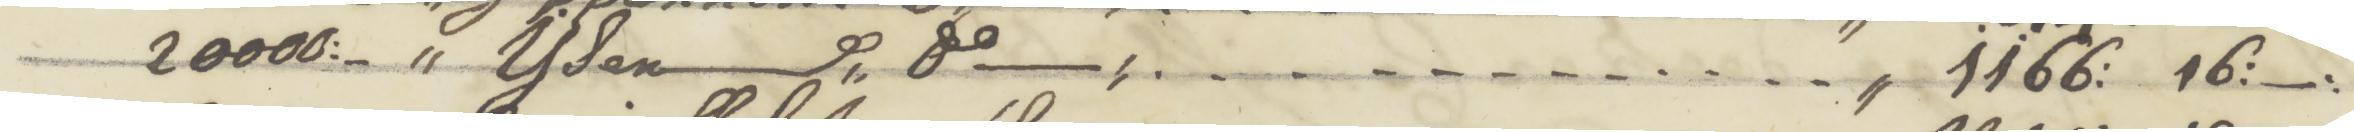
20000: — „ IJser _ „o d„o — „ - - - - - - - - - - - - „ 1166: 16: —:
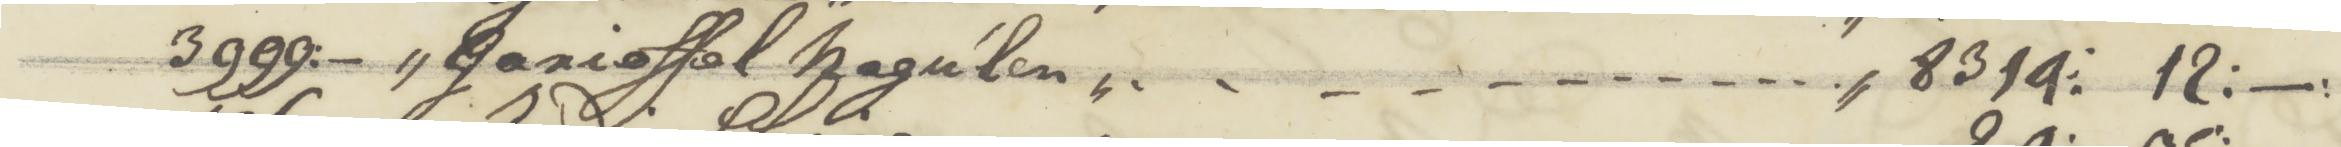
3999: — „ Garieffel nagulen „ - - - - - - - - - - - - „ 8314: 12: —:
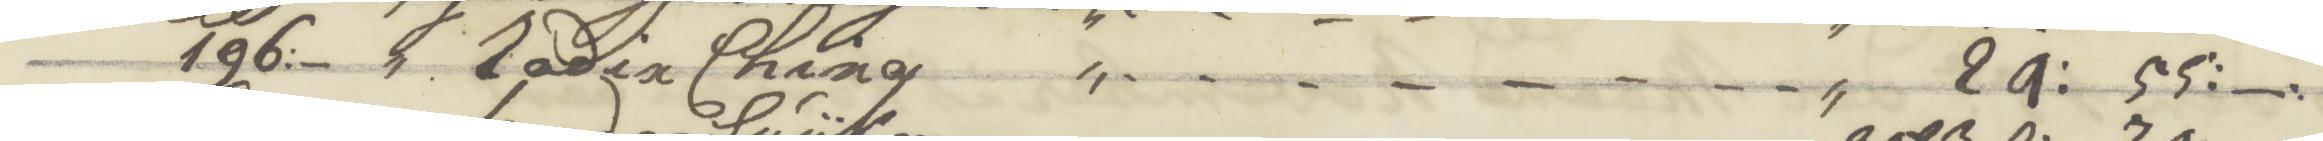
196: — „ Radix Ching „ - - - - - - - - „ 24: 55: —:
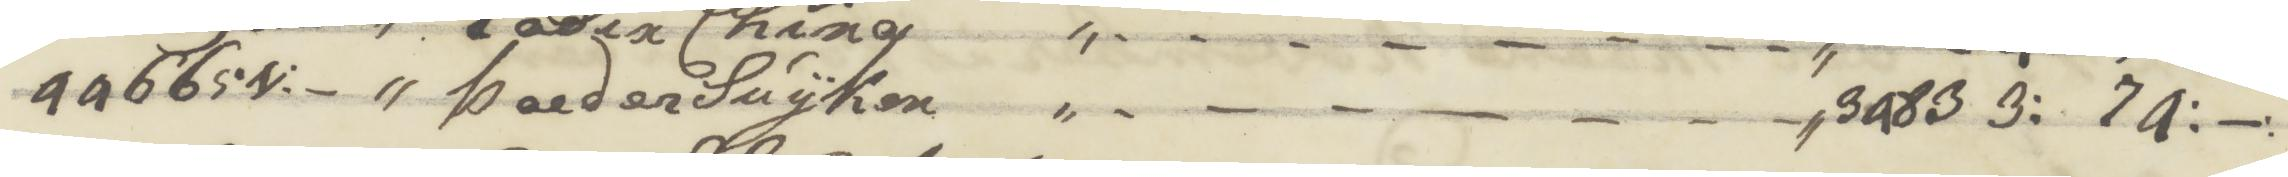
446651: — „ Poedersuijker „ - - - - - - - „ 34833: 74: —:
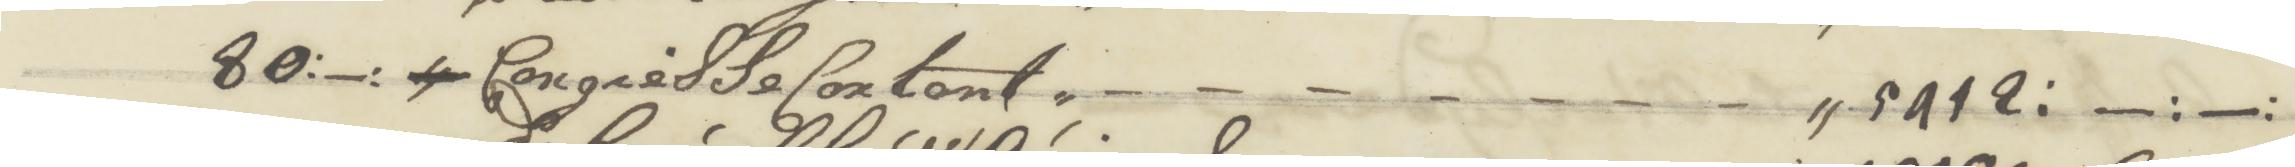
80: —: „ Corgiesse Cortont „ - - - - - - - „ 5412: —: —:
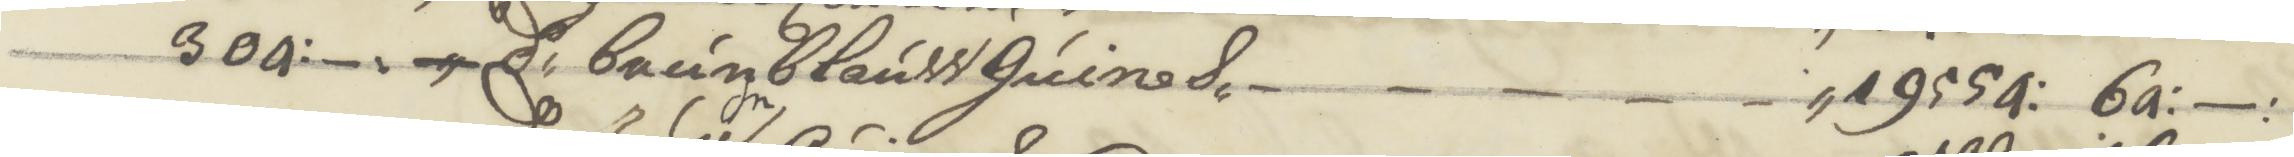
304: —: „ d„o bruynblauw Guines „ - - - - - „ 19554: 64: —:
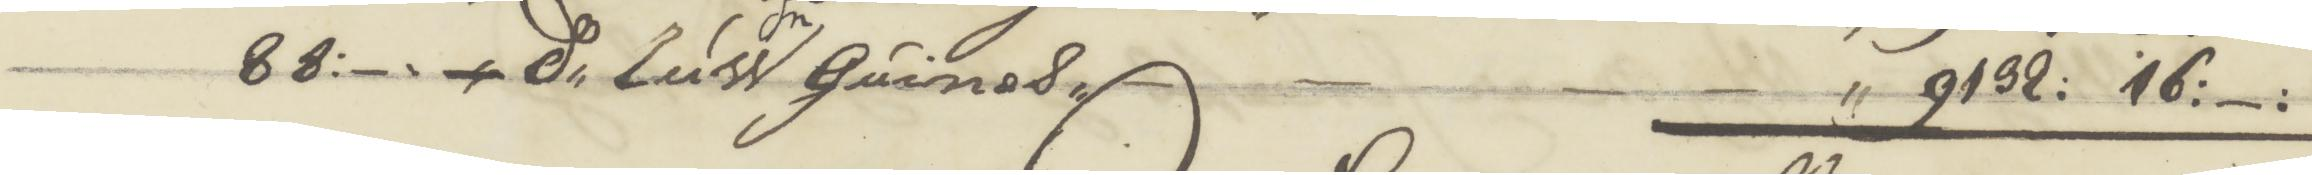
88: —: „ d„o Ruwn Guines „ - - - „ 9132: 16 : —:
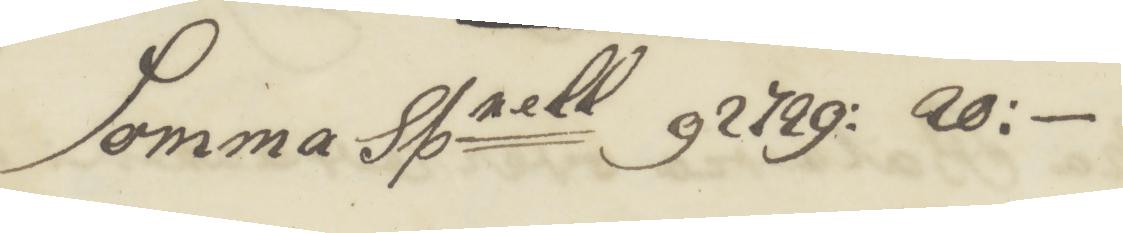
Somma sp=rell 92729: 20: —
